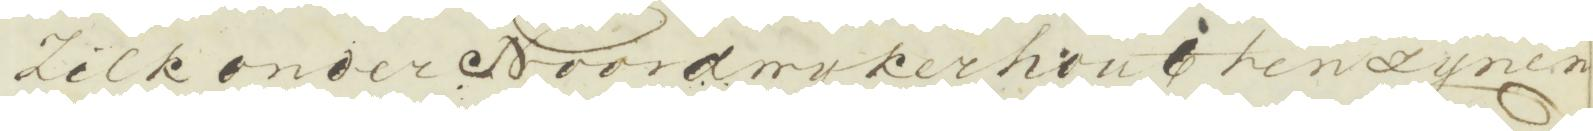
Zilk onder Noordwykerhout ten zynen
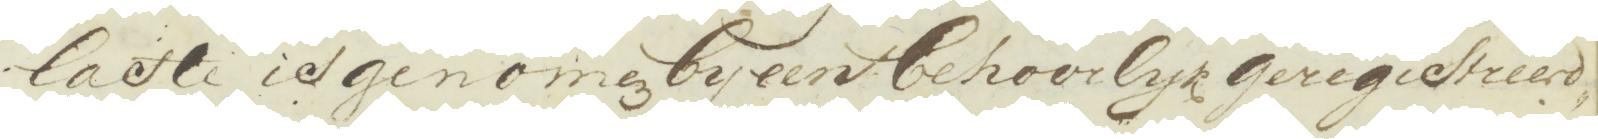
laste is genomen by een behoorlyk geregistreerd,
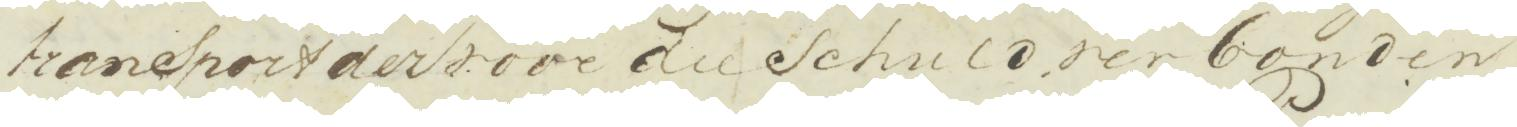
transport der voor die schuld, verbonden
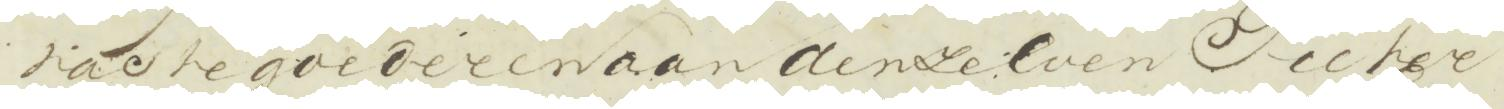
vaste goederen aan denzelven Pieter
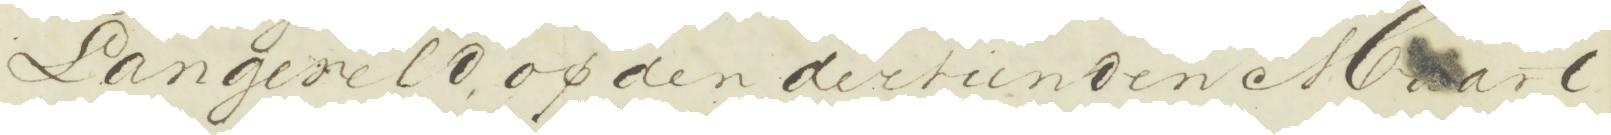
Langeveld, op den dertienden Maart
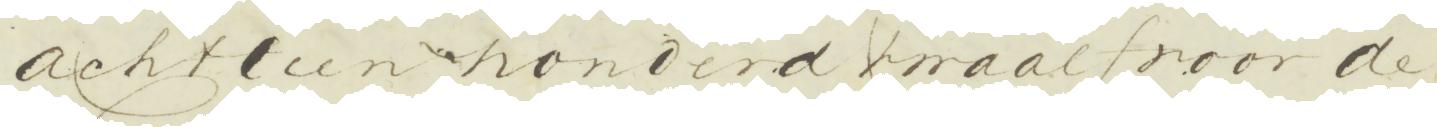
achttien honderd twaalf voor de
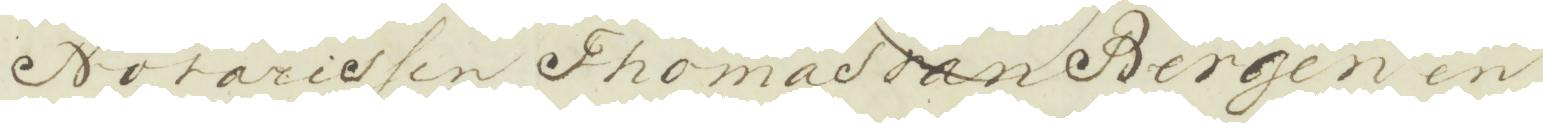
Notarissen Thomas van Bergen en
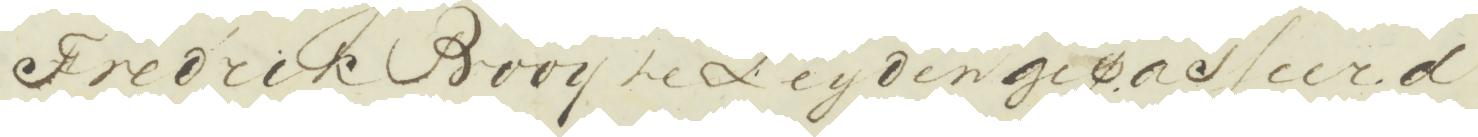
Fredrik Booy te Leyden gepasseerd
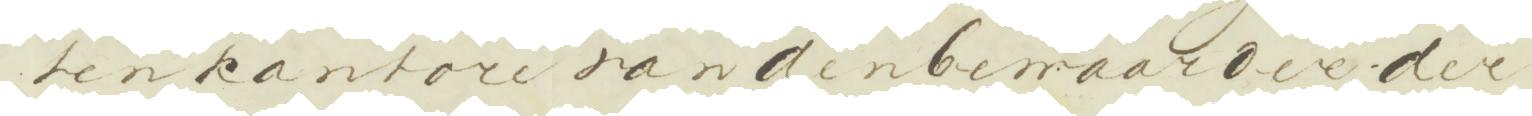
ten kantore van den bewaarder der
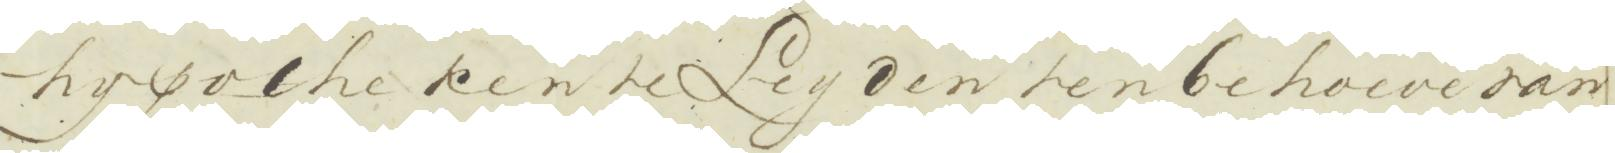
hypotheken te Leyden ten behoeve van
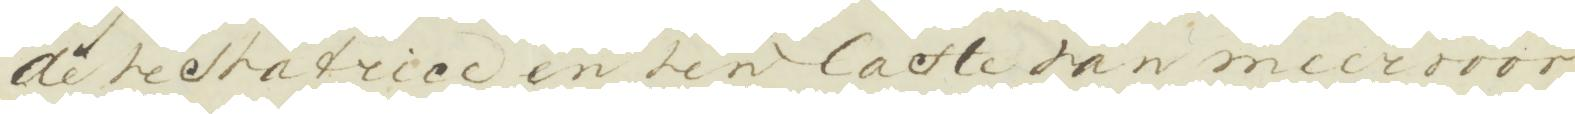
de testatrice en ten laste van meer voor
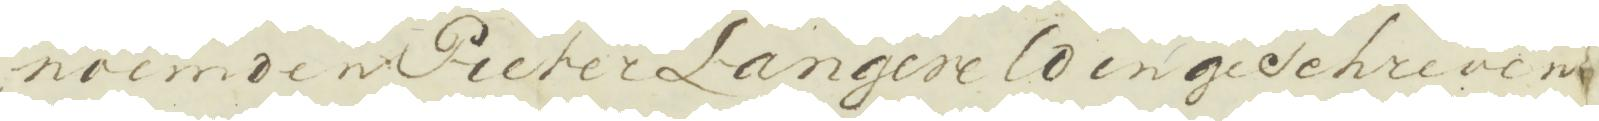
noemden Pieter Langeveld ingeschreven
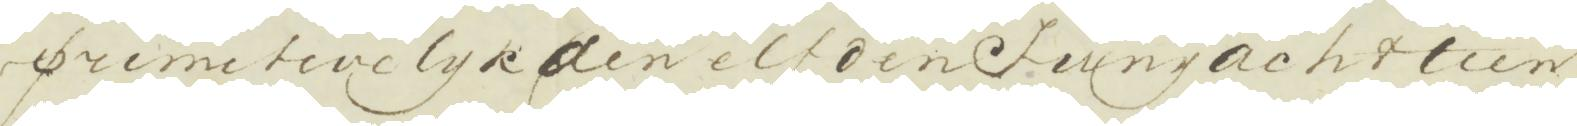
primitivelyk den elf den Iuny achttien
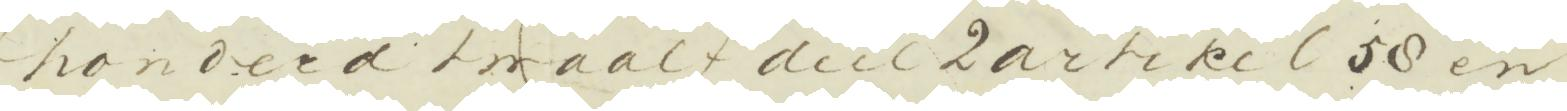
honderd twaalf deel 2 artikel C 58 en
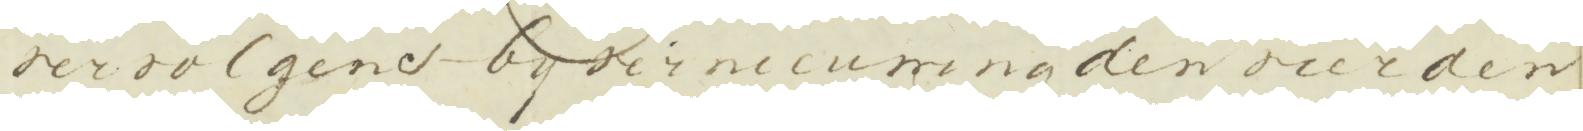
vervolgens by vernieuwing den vierden
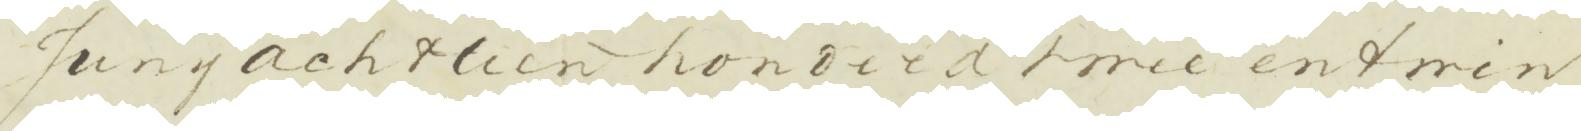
Juny achttien honderd twee en twin
